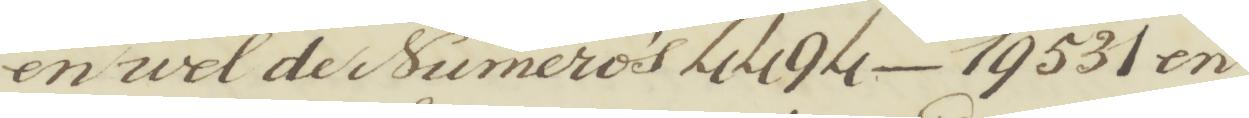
en wel de Numeros 4494 — 19531 en
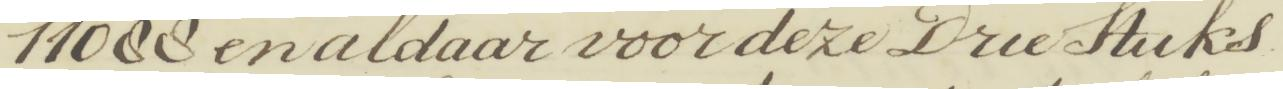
11088 en aldaar voor deze Drie Stuks
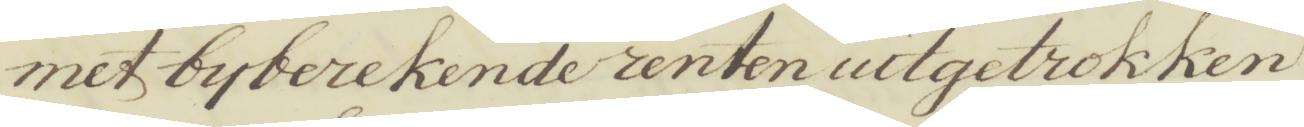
met byberekende renten uitgetrokken
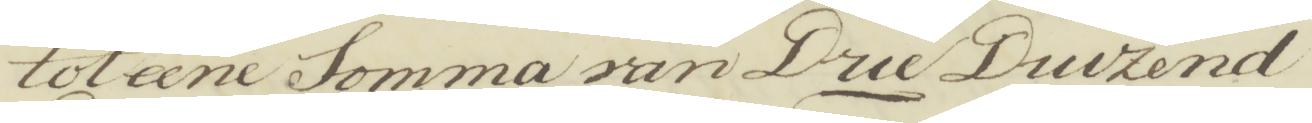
tot eene Somma van Drie Duizend
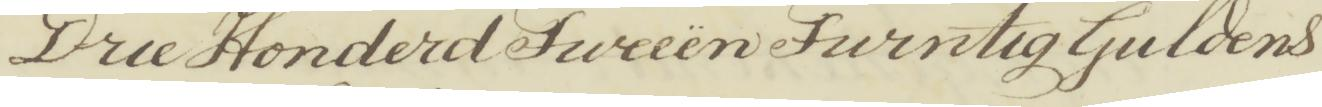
Drie Honderd Tweeën Twintig Guldens
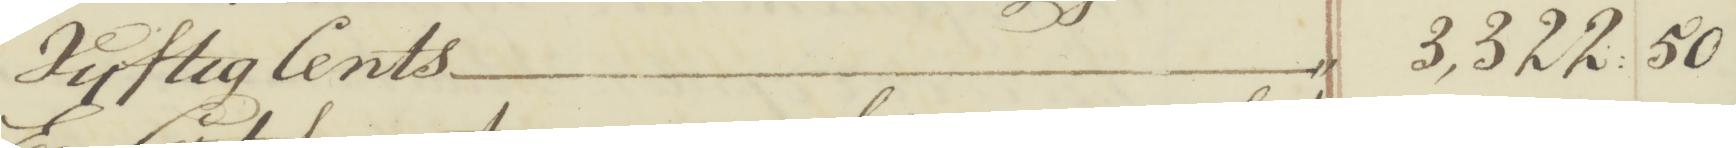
Vyftig Cents — „ 3,322: 50
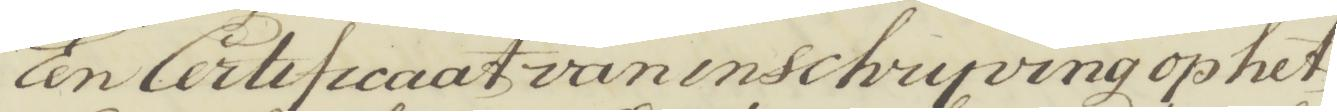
een Certificaat van inschryving op het
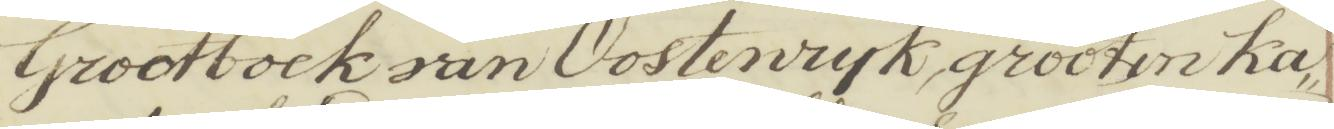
Grootboek van Oostenryk, groot in Ka„
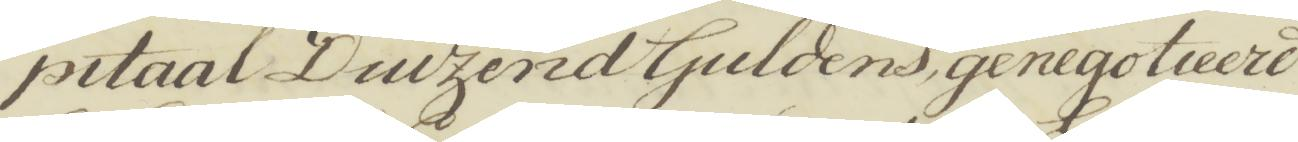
pitaal Duizend Guldens, genegotieerd
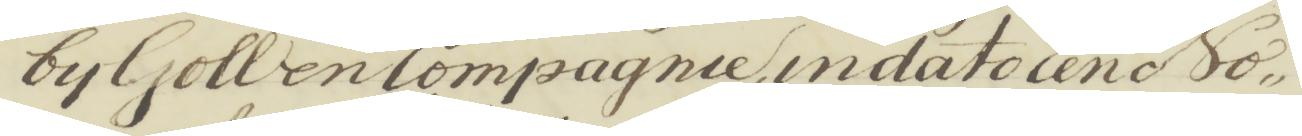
by Goll en Compagnie, in dato Een No„
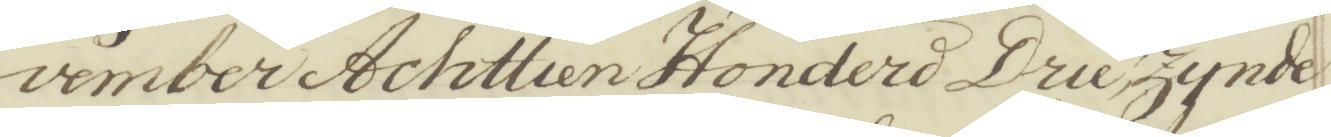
vember Achttien Honderd Drie, zynde
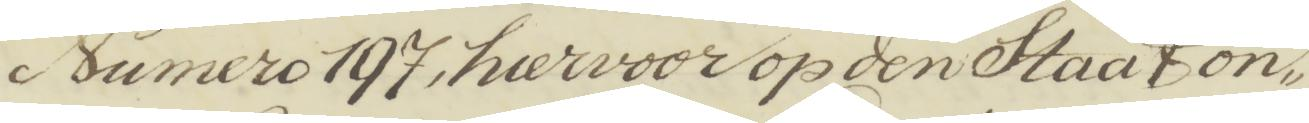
Numero 197, hiervoor op den Staat on„
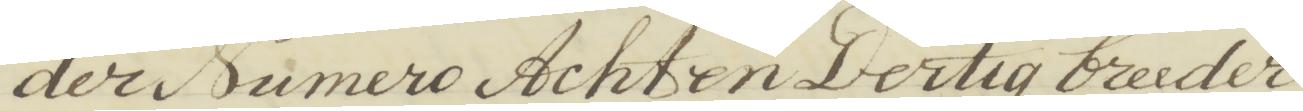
der Numero Achten Dertig breeder
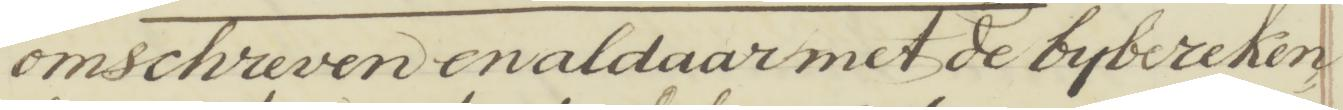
omschreven en aldaar met de bybereken„
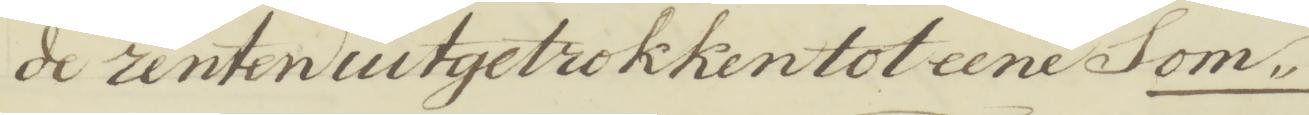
de renten uitgetrokken tot eene Som„
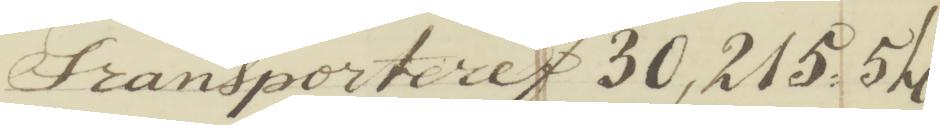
Transportereƒ 30,215:54
